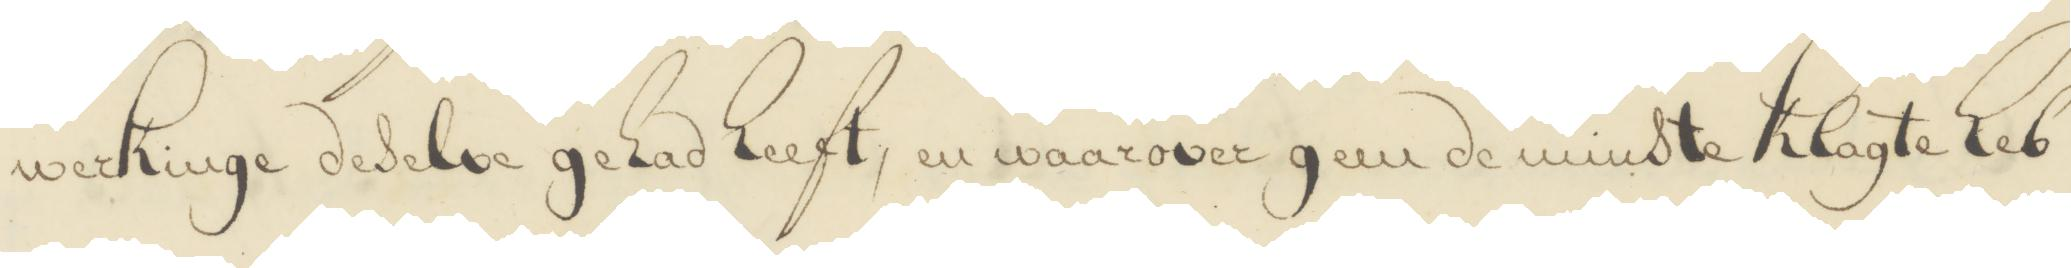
werkinge deselve gehad heeft, en waarover geen de minste klagte heb
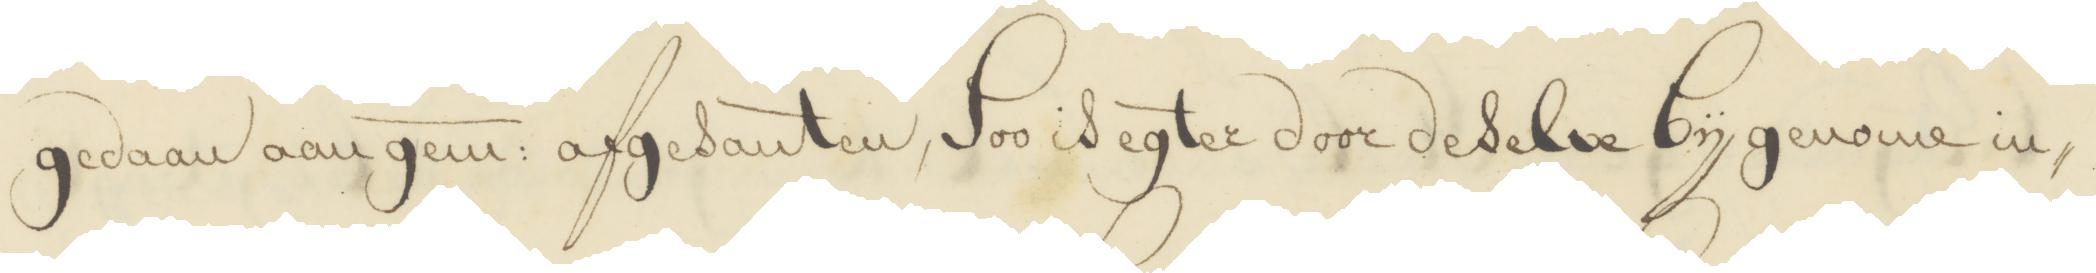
gedaan aan gem: afgesanten, soo is egter door deselve bij genome in„
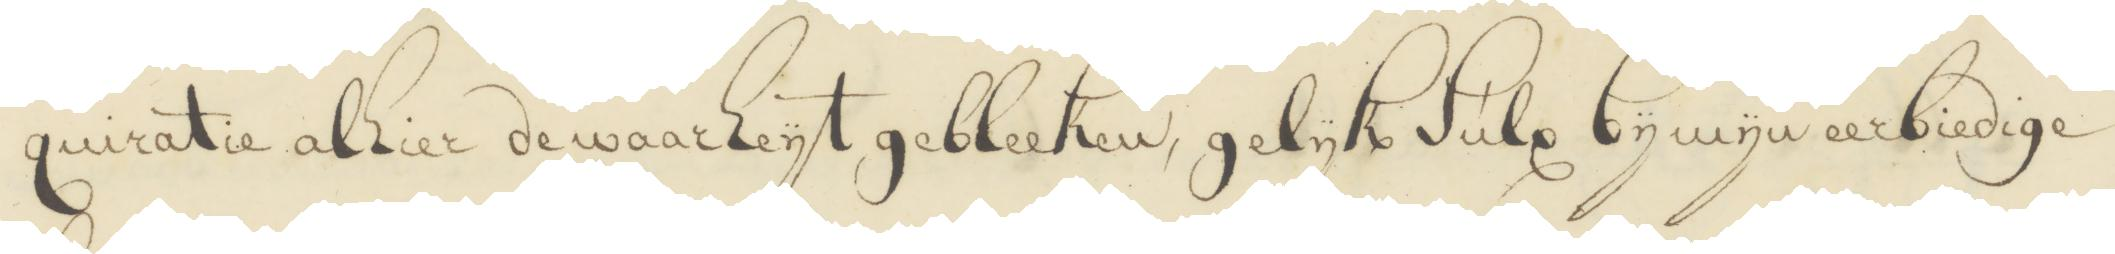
quiratie alhier de waarheijt gebleeken, gelijk sulx bij mijn eerbiedige
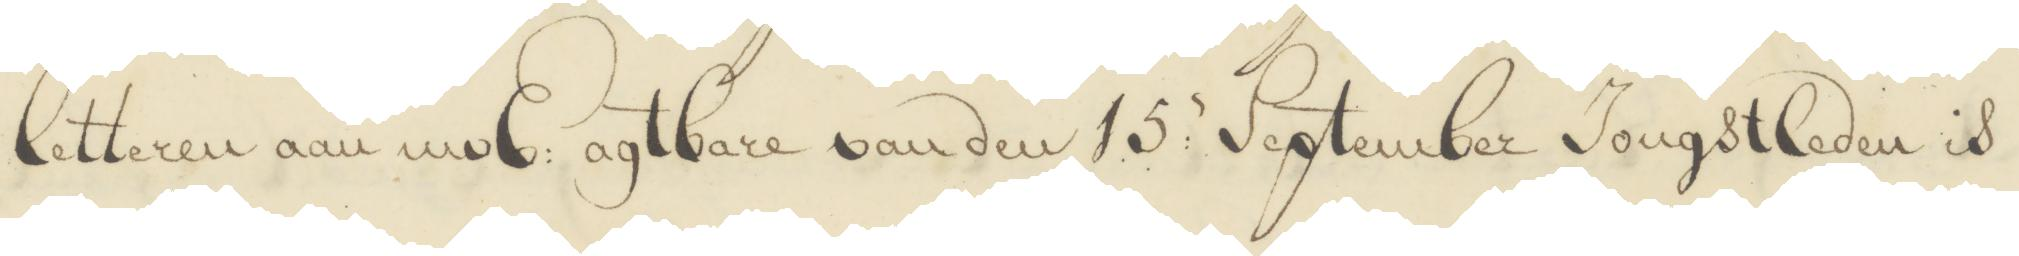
letteren aan uw E: agtbare van den 15:en September Jongstleden is
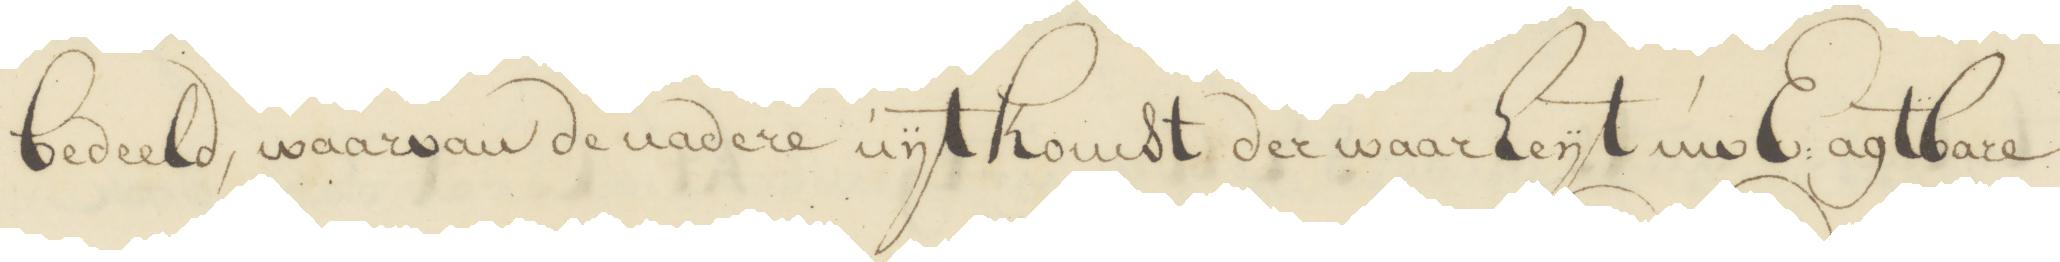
bedeeld, waarvan de nadere uijtkomst der waarheijt uw E: agtbare
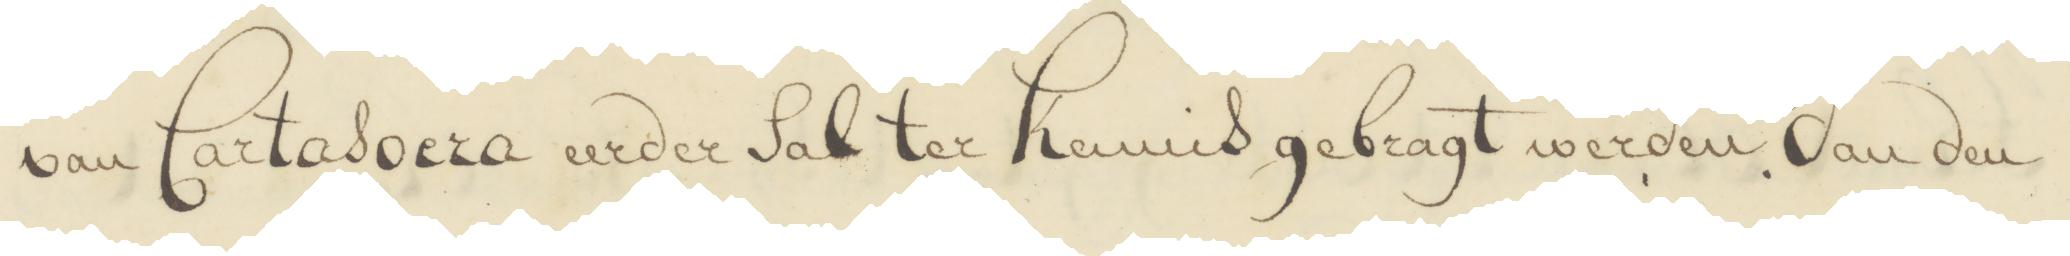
van Cartasoera eerder sal ter kennis gebragt werden dan den
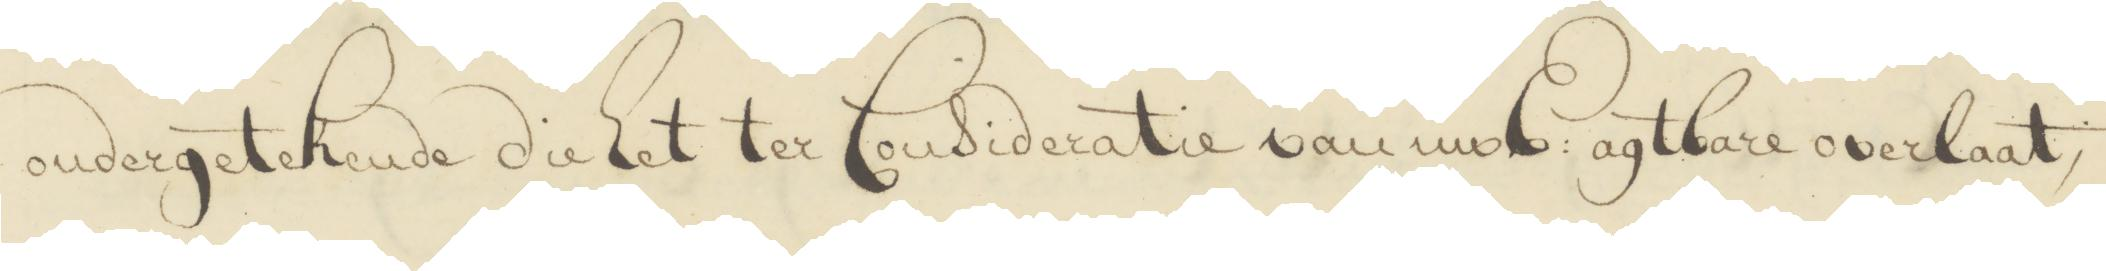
ondergetekende die het ter Consideratie van uw E: agtbare overlaat,
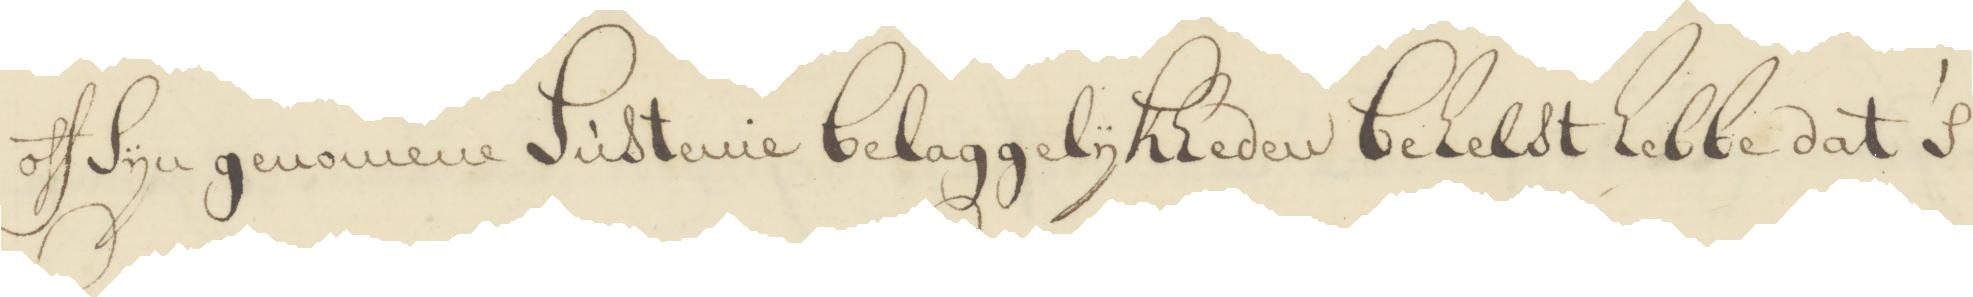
off sijn genomene sustenie belaggelijkheden behelst hebbe dat 's
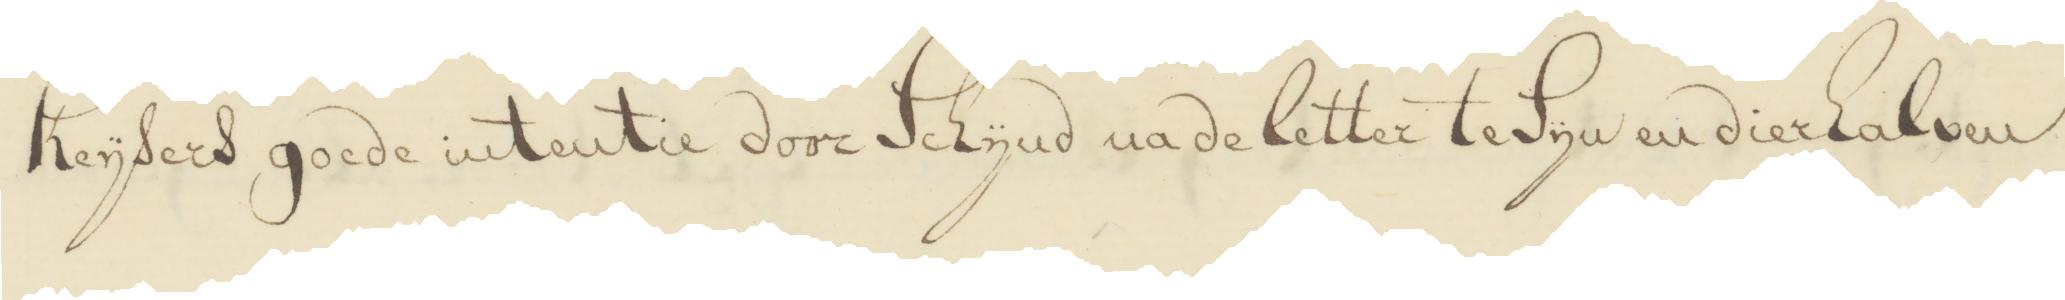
keijsers goede intentie door schijnd na de letter te sijn en dierhalven
